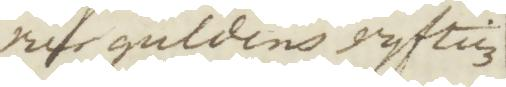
vier guldens vyftien
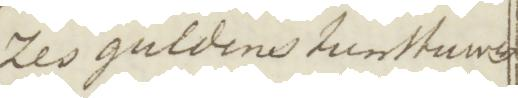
zes guldens tien stuwer
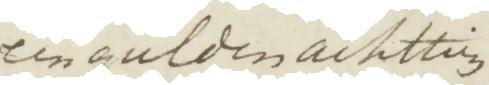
een gulden achttien
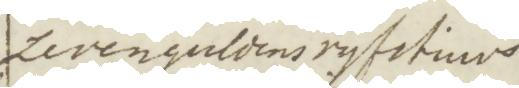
Zeven guldens vyf stuivs
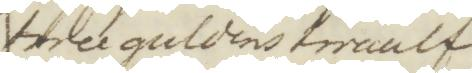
twee guldens twaalf
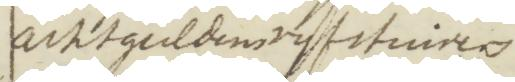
acht guldens vyf stuivers
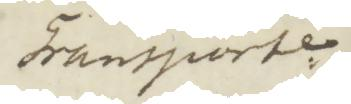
Transporte,
